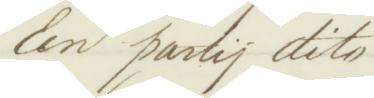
Een partij dito
